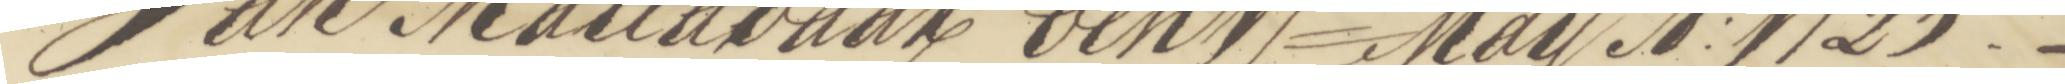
Van Mallabaar den 17=e Maij A:o 1725.
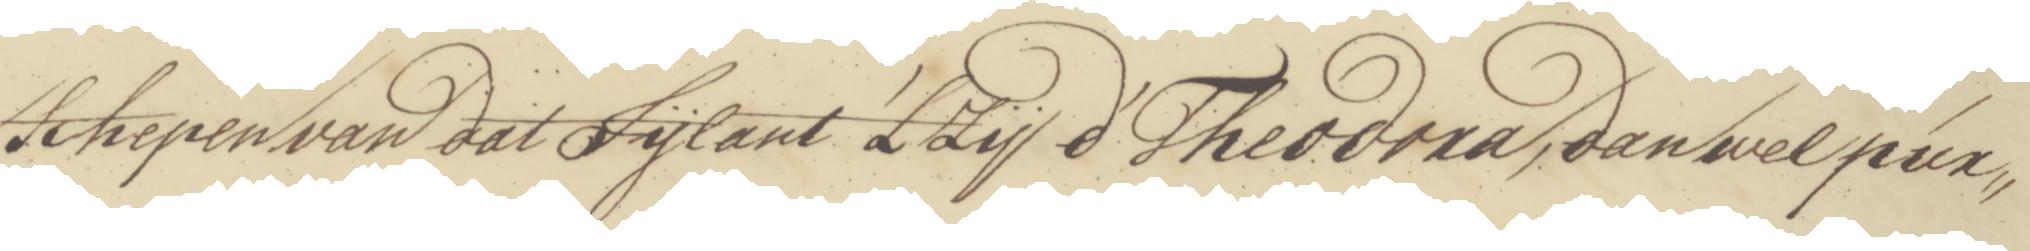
schepen van dat Eijlant 't zij d’Theodora, dan wel pur„
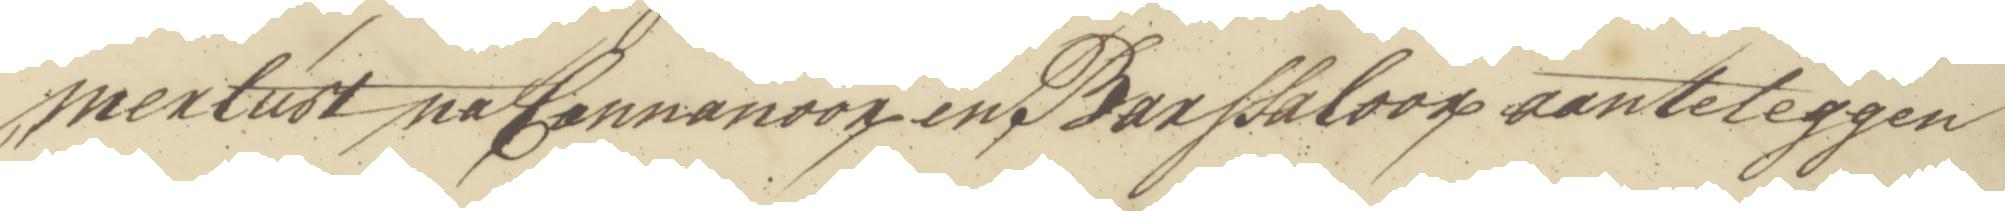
„merlust na Cannanoor en Barssaloor aanteleggen
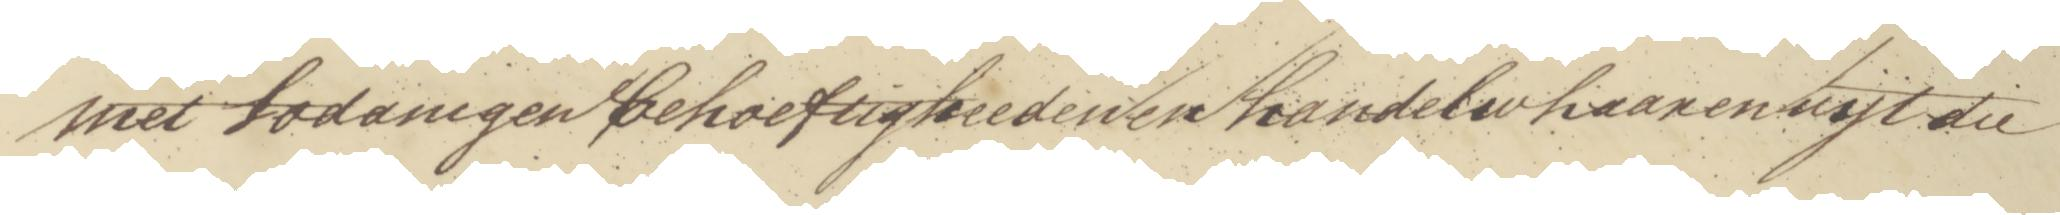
met sodanigen behoeftigheeden en handelwhaaren uijt die
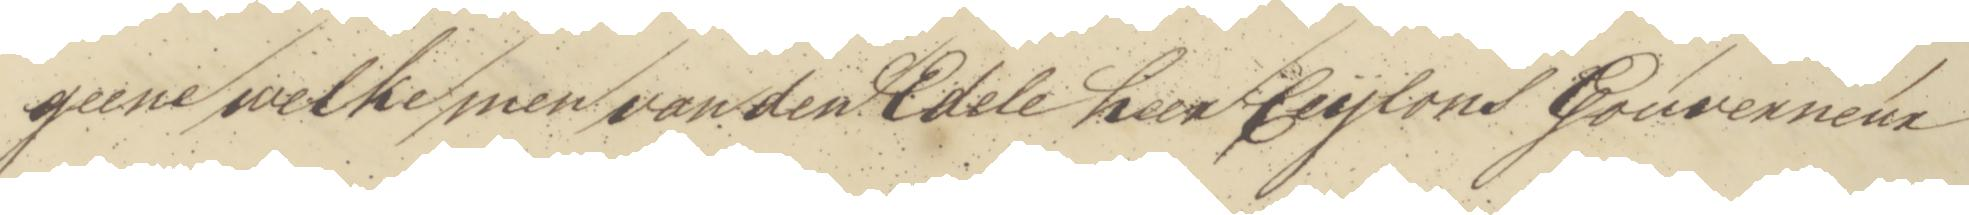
geene welke men van den Edele heer Ceijlons Gouverneur
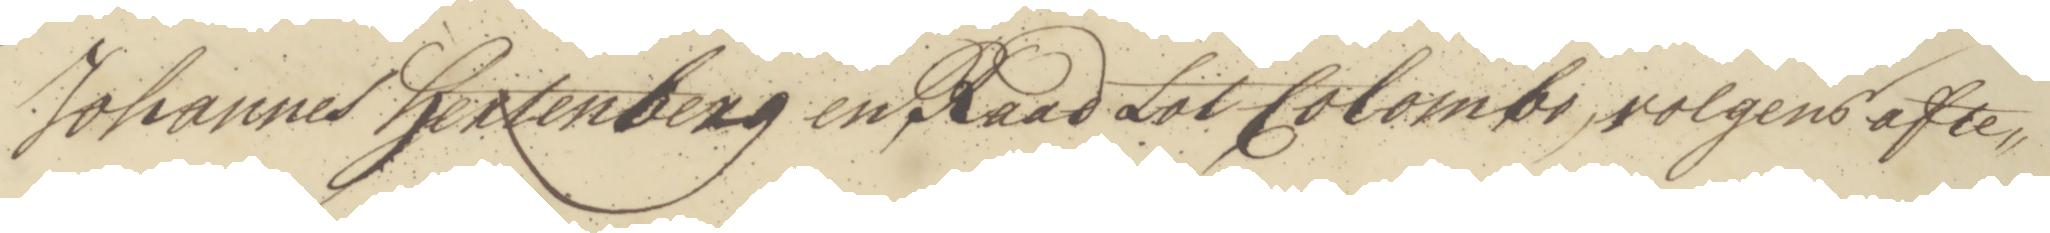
Johannes Hertenberg en Raad tot Colombo, volgens afte„
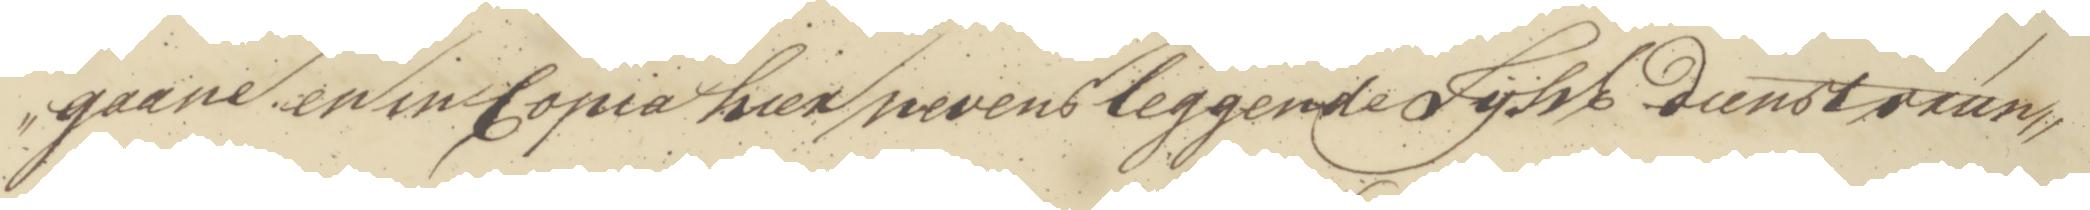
„gaane en in Copia hier nevens leggende Eijsch dienst vrun„
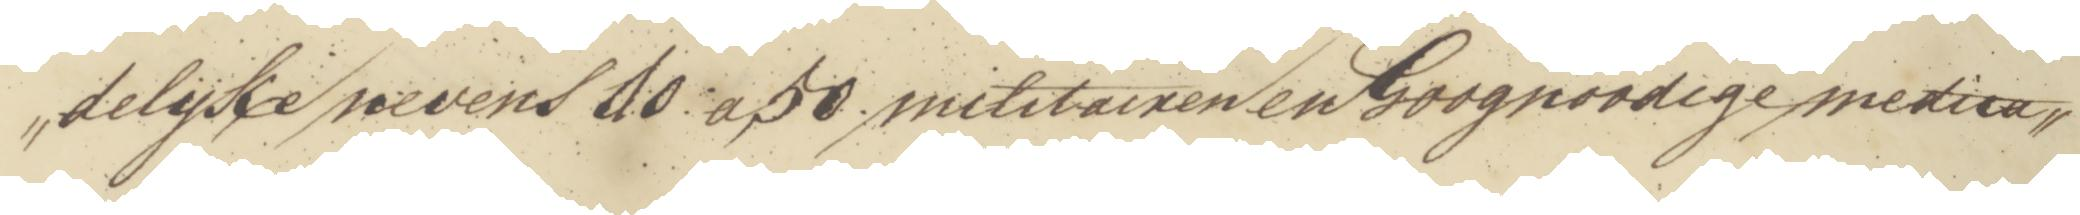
„delijke nevens 40: a 50. militairen en hoognoodige medica„
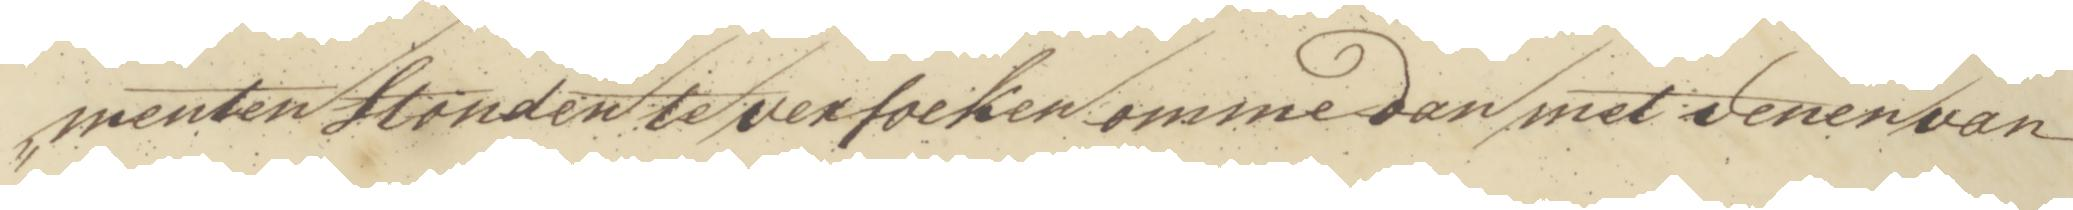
„menten stonden te versoeken omme dan met eenen van
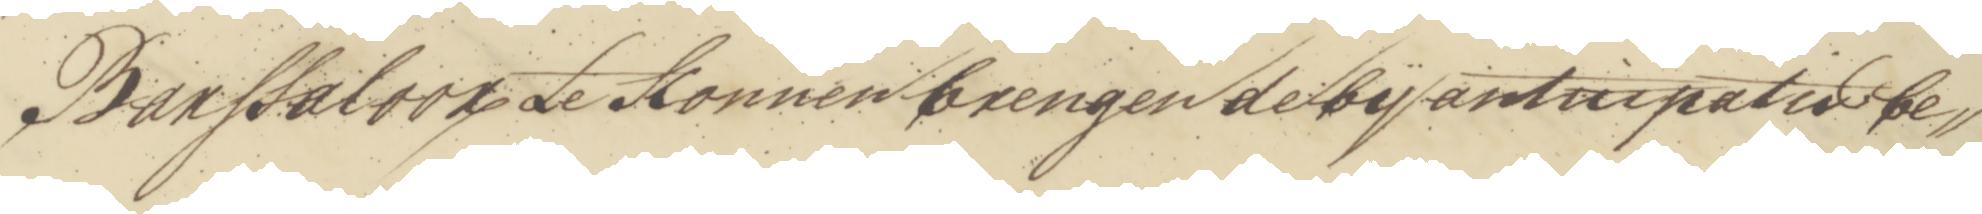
Barssaloor te konnen brengen de bij anticipatie be„
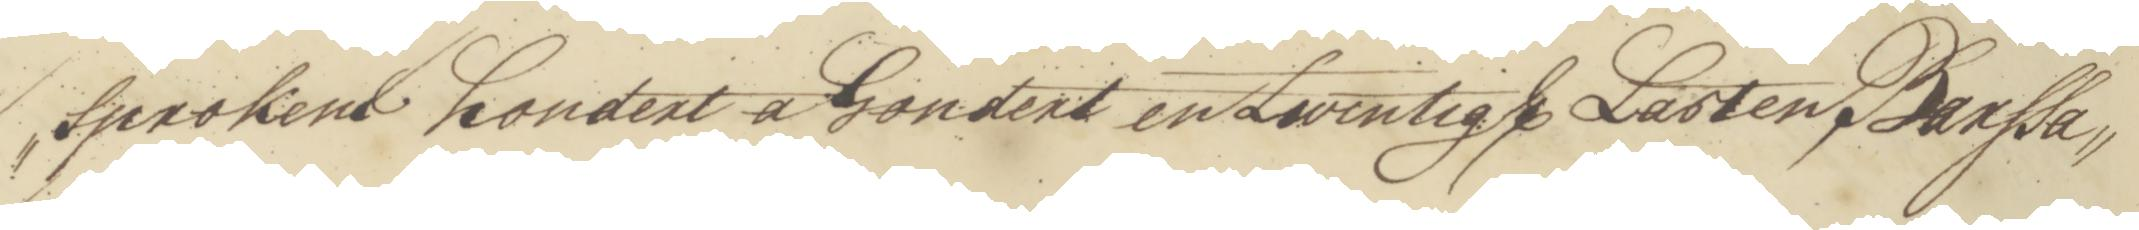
„sprokene hondert a hondert en twintigh Lasten Barssa„
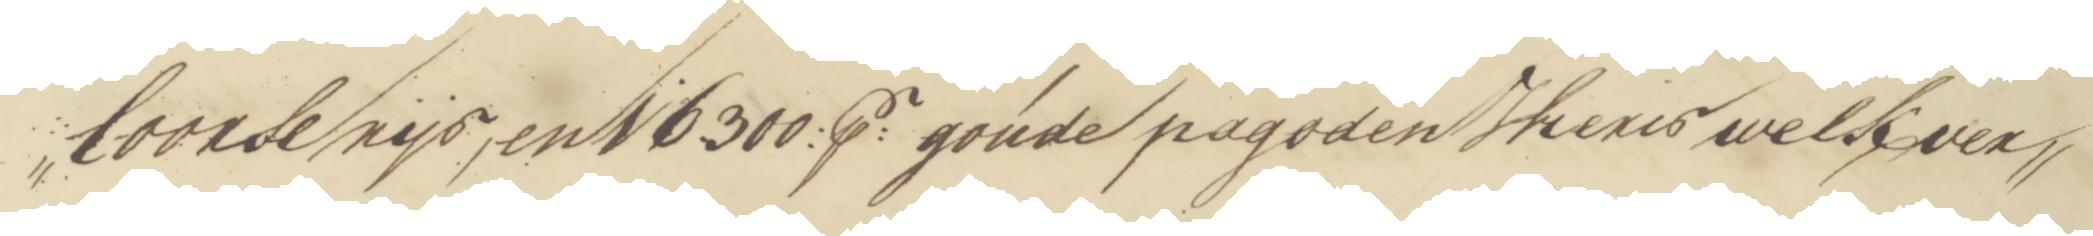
„loorse rijs, en 16300: p:s goude pagoden Ikeris welk ver„
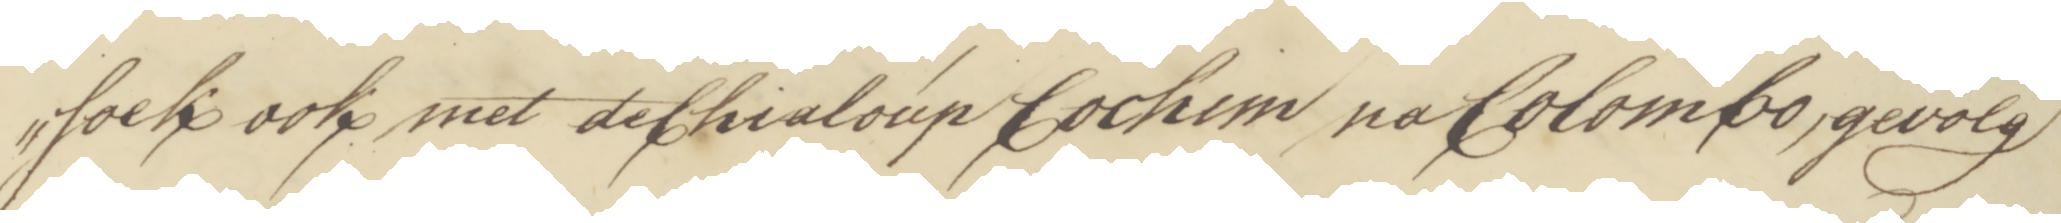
„soek ook met de Chialoup Cochim na Colombo, gevolg
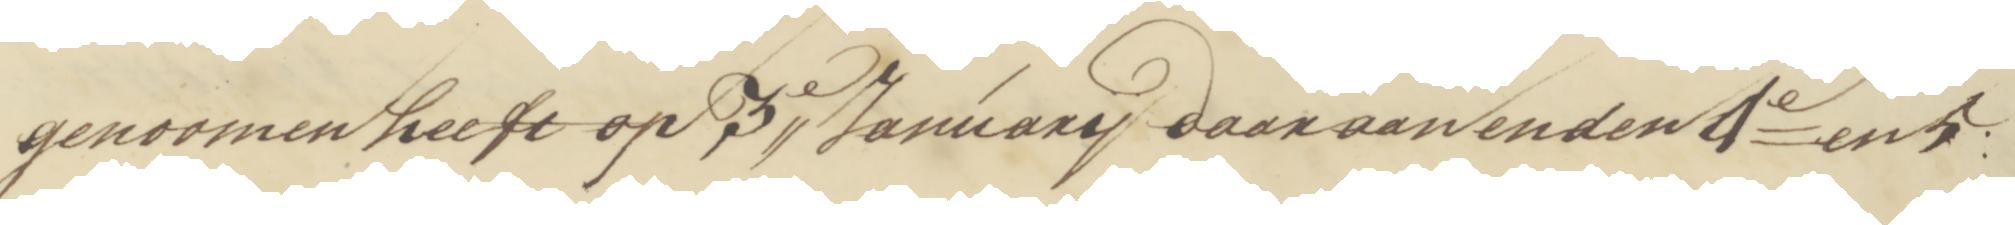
genoomen heeft op 3„e Januarij daar aan en den 4=e en 5:
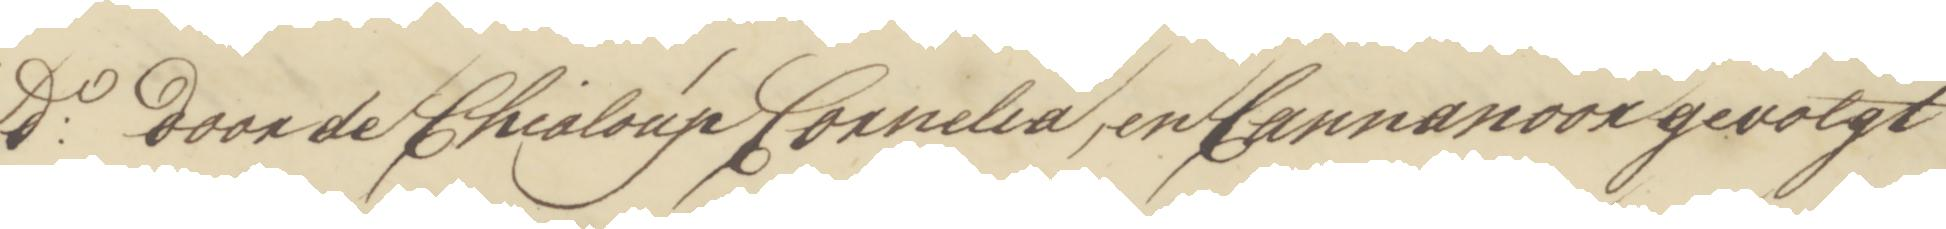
d:o door de Chialoup Cornelia, en Cannanoor gevolgt
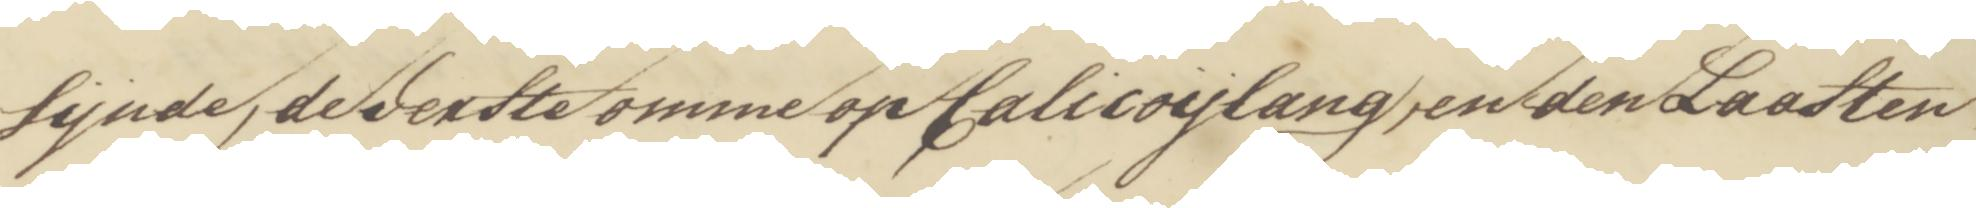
sijnde, de Eerste omme op Calicoijlang, en den Laasten
